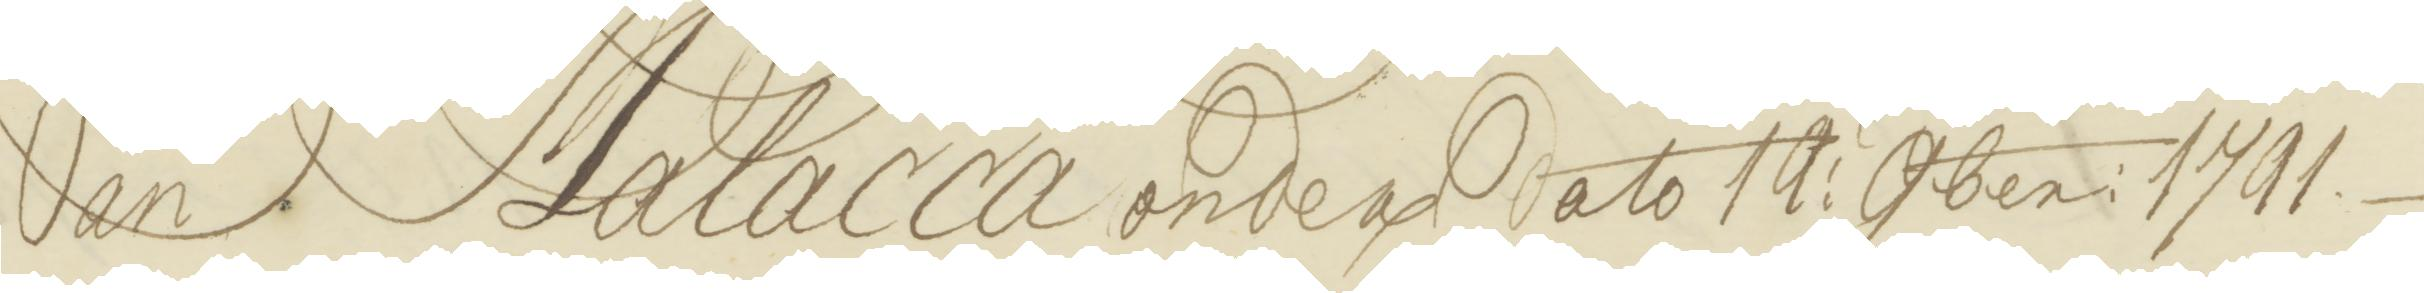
Van Malacca onder dato 14:' 9ber: 1741.—
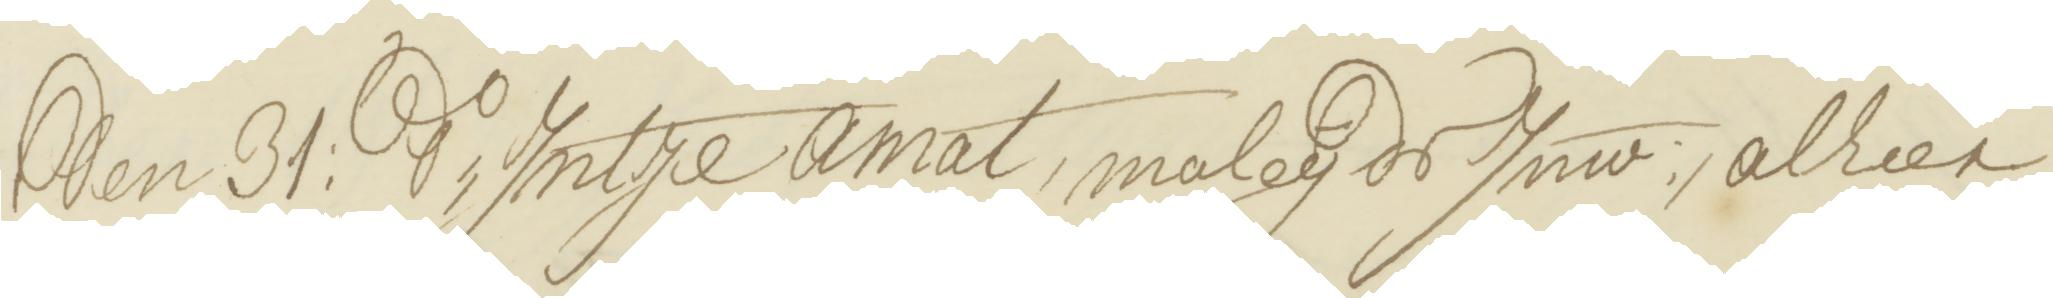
den 31: d„o Jntje amat, maleijds Jnw:/ alhier
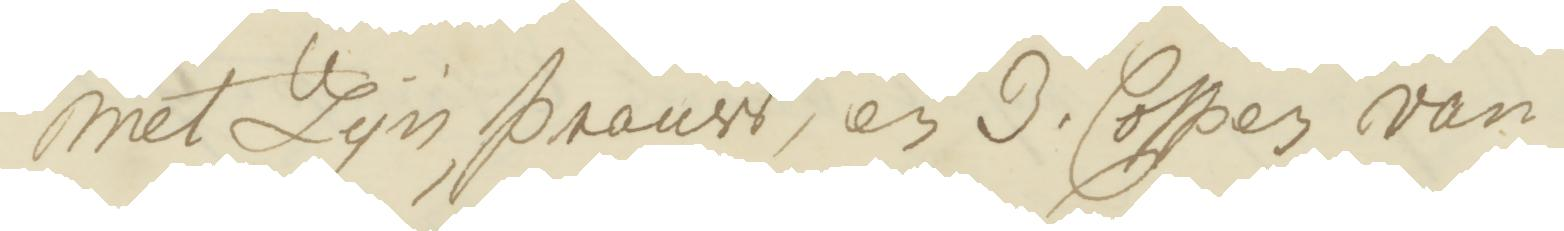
met zijn prauw, en 3. Coppen van
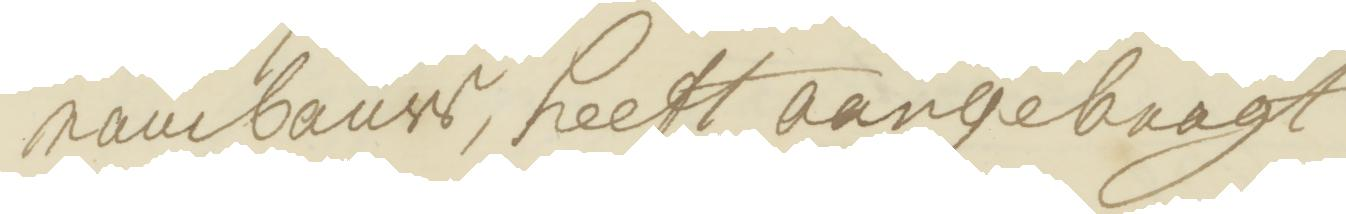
raubauw, heeft aangebragt
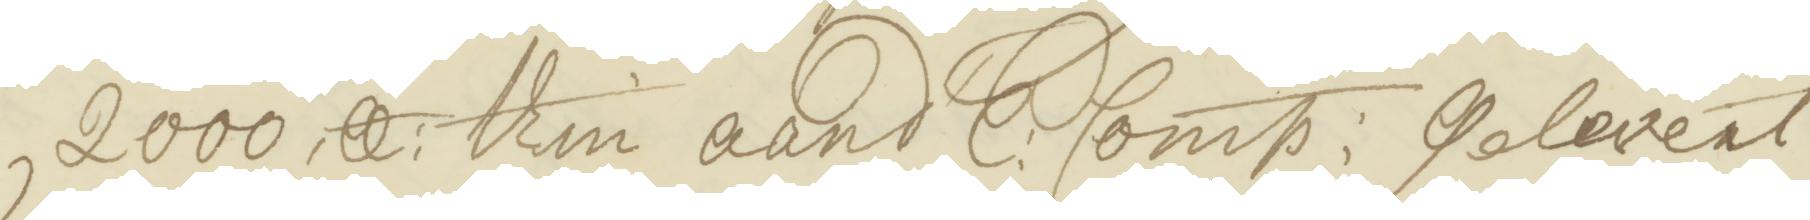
2000, lb: thin aan d' E: Comp; gelevert
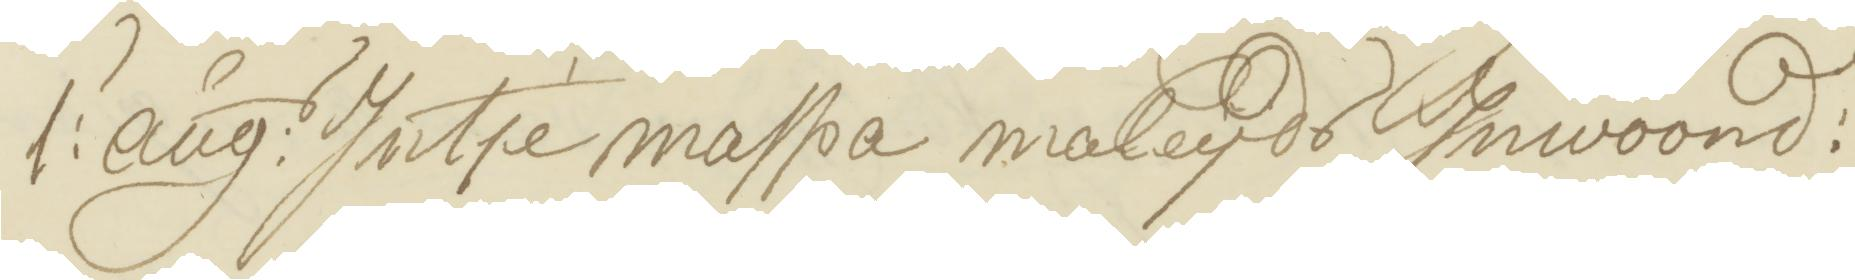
1:' aug:s Intje mappa maleijds Jnwoord:r
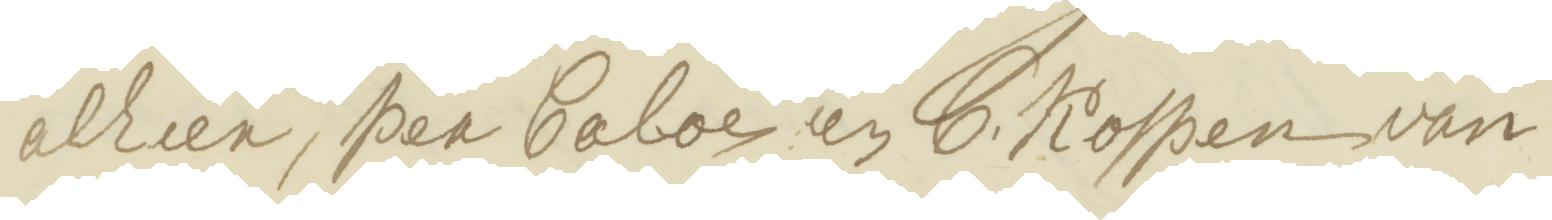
alhier, per baloe en 6. koppen van
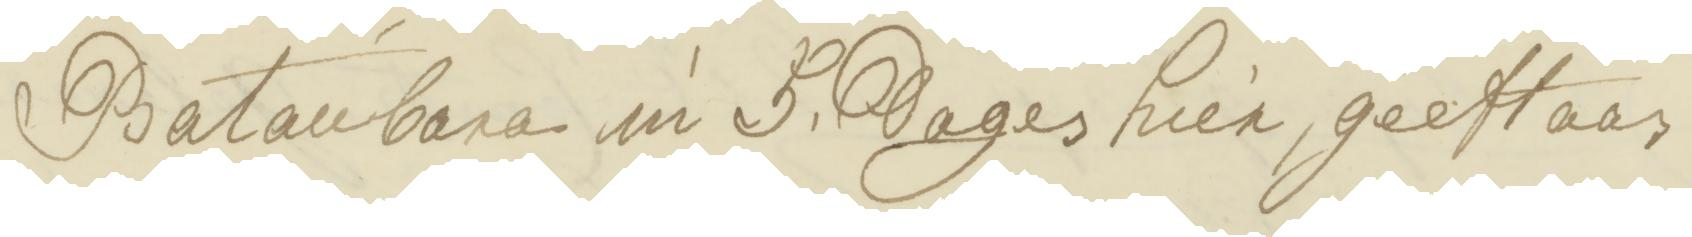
Bataubara in 5. dagen hier, geeft aan
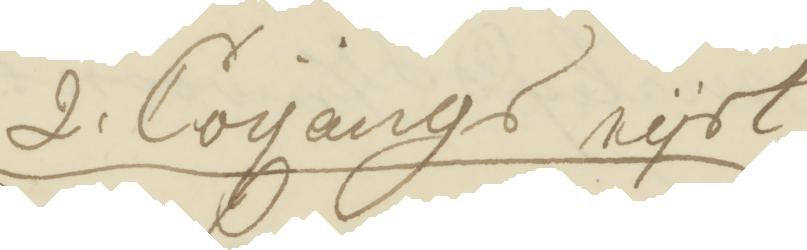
2. Coijangs rijst
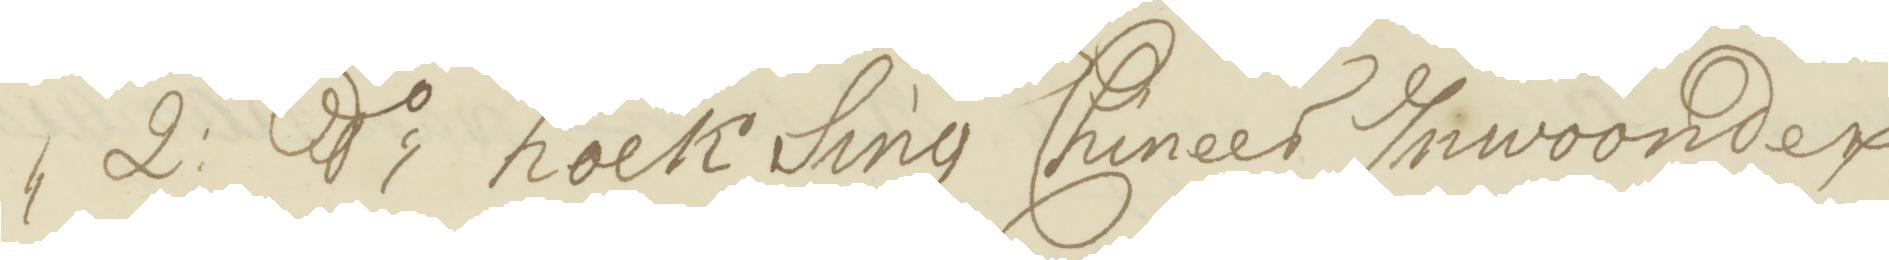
„ 2: d„o hoek sing Chinees Jnwoonder
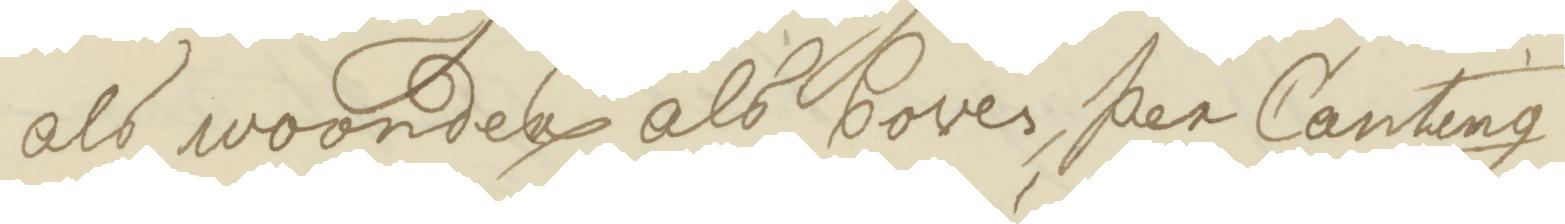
als woonden als boves, per Canting
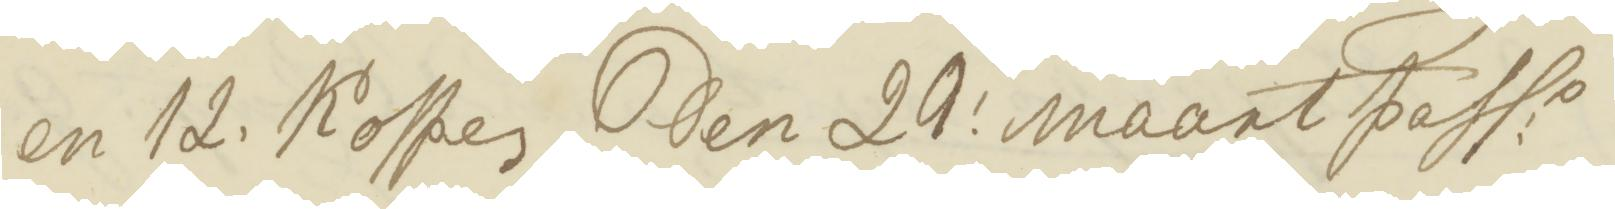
en 12. koppen, den 24:' maart pass:o
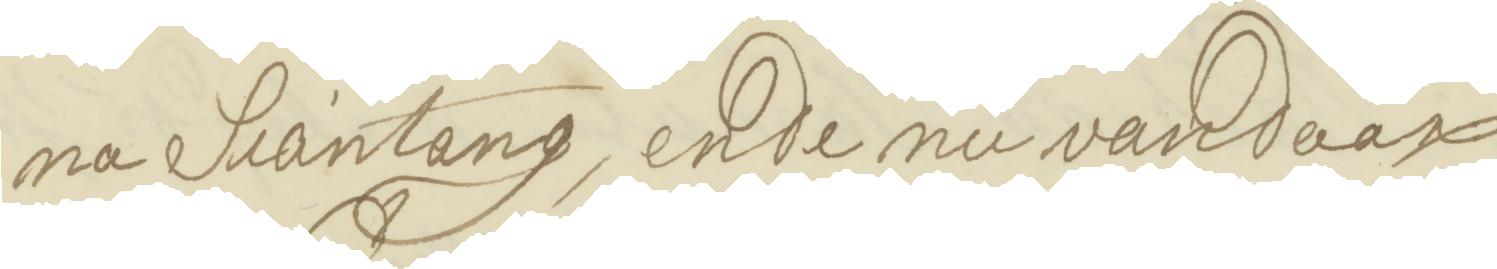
na Siantang, ende nu van daar
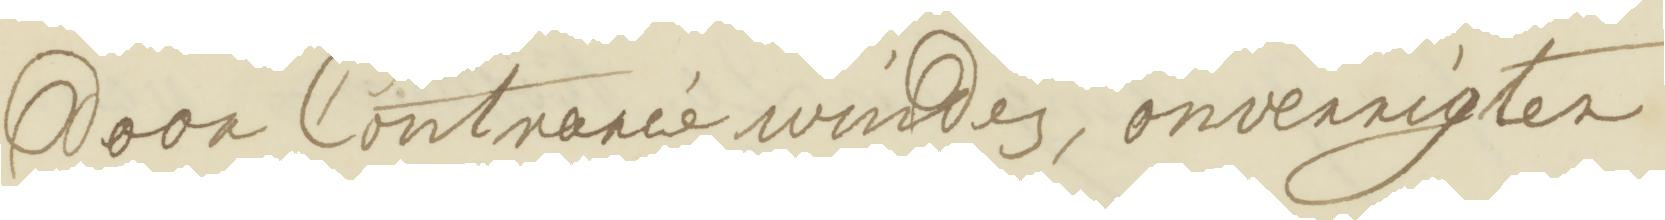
door Contrarie winden, onverrigter
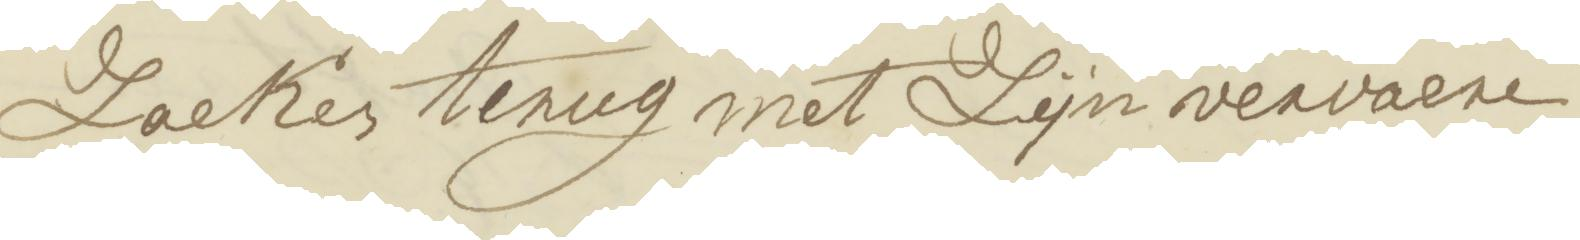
zaeken terug met zijn vervaere
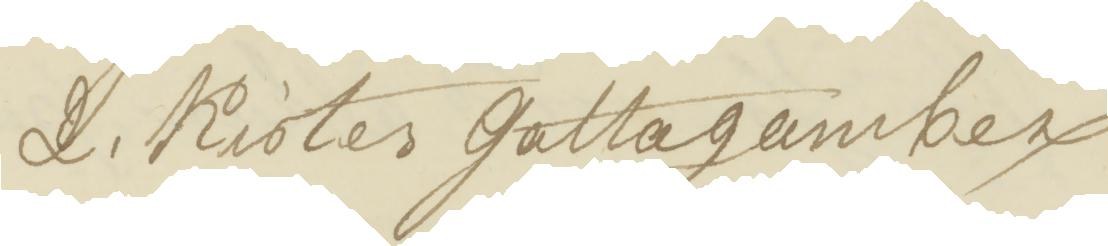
2. kisten gattagamber
